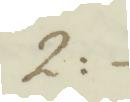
2 : —
